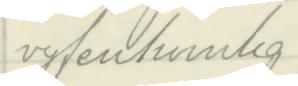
vyf entwintig
